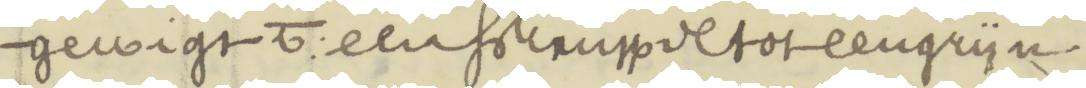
–gewigt 6: een schruppel tot een grijn.
